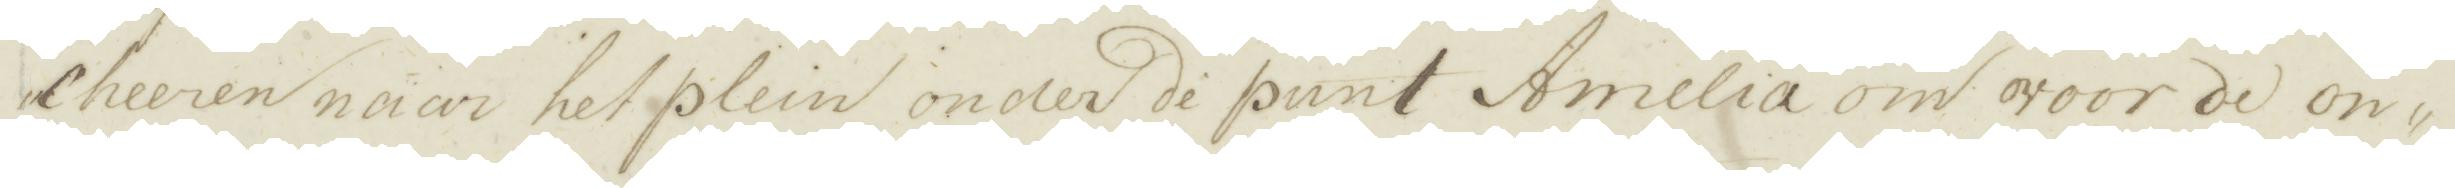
„cheeren naar het plein onder de punt Amelia om voor de on„
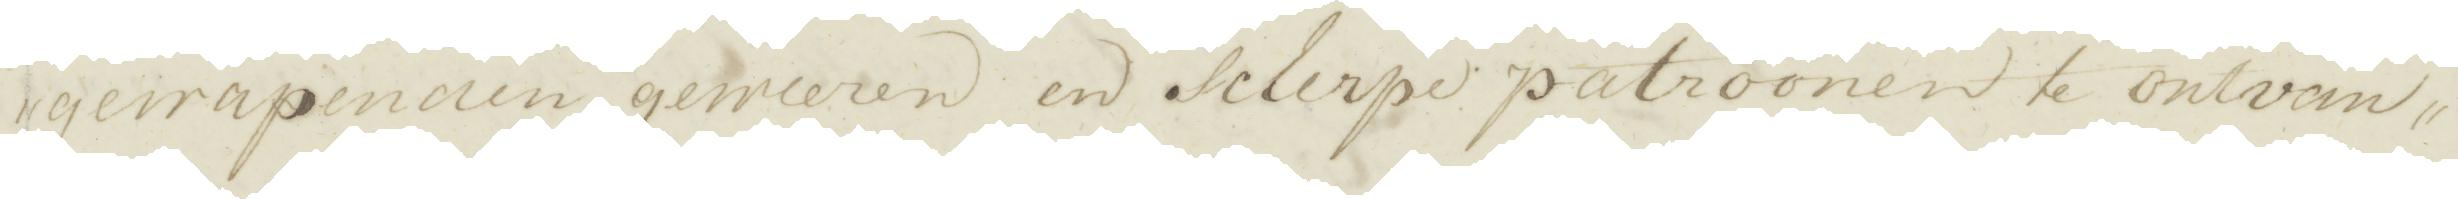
„gewapenden geweeren en scherpe patroonen te ontvan„
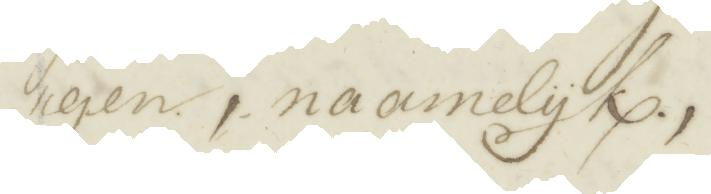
gen. , naamelijk.,
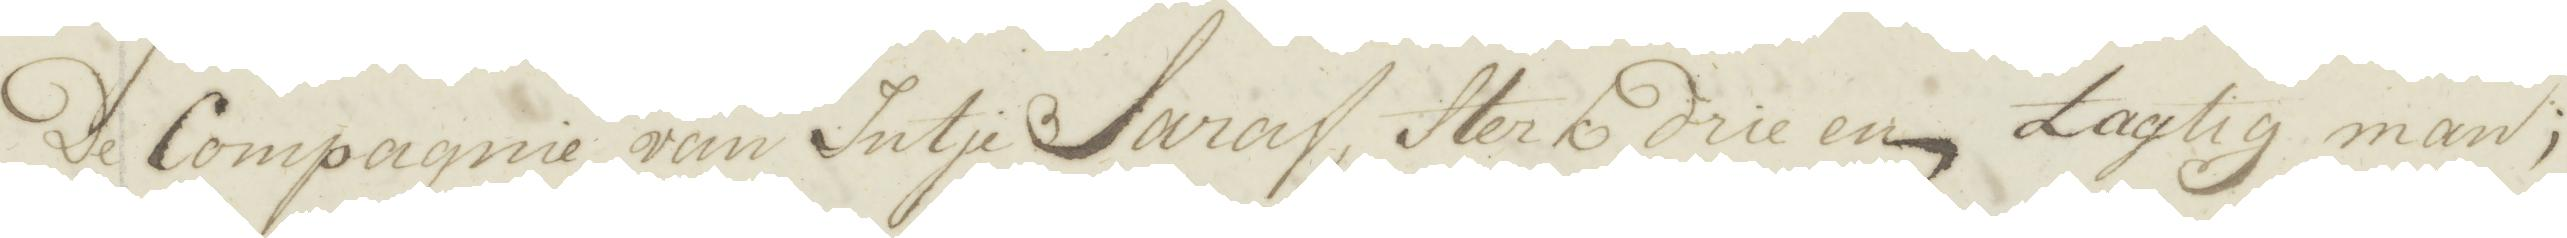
De Compagnie van Intje Saraf, Sterk drie en tagtig man;
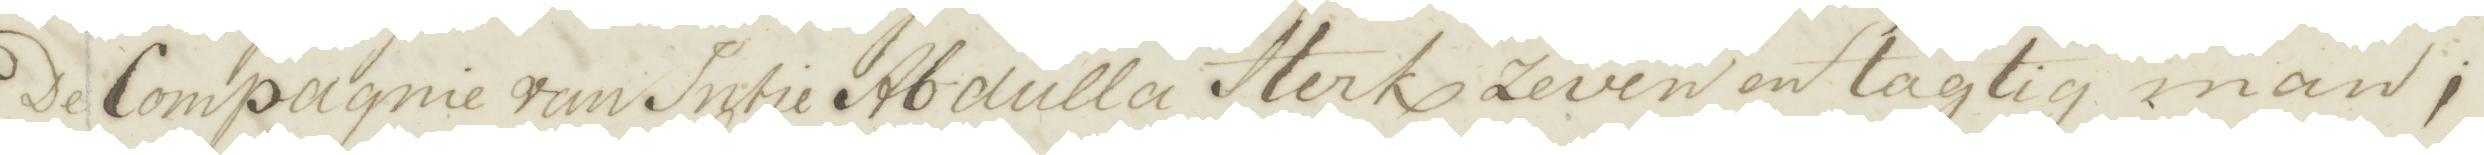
De Compagnie van Intje Abdulla Sterk zeven en tagtig man;
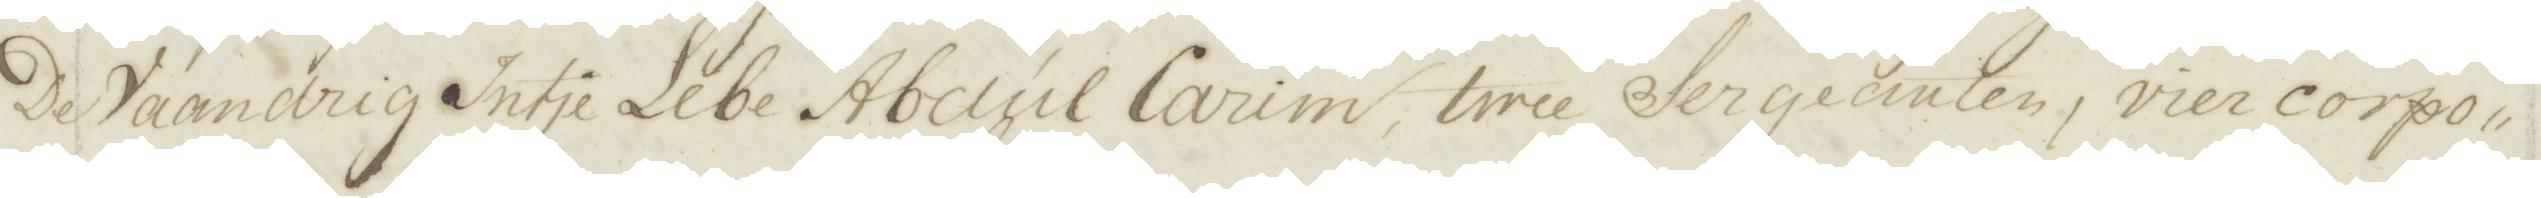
De Vaandrig Intje Lebe Abdul Carim, twee sergeanten, vier corpo„
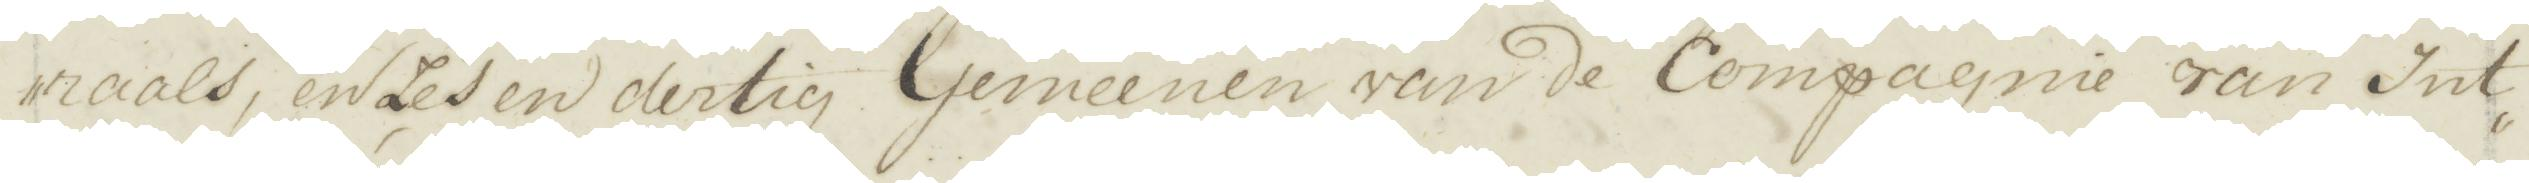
„raals, en Zes en dertig Gemeenen van de Compagnie van Int„
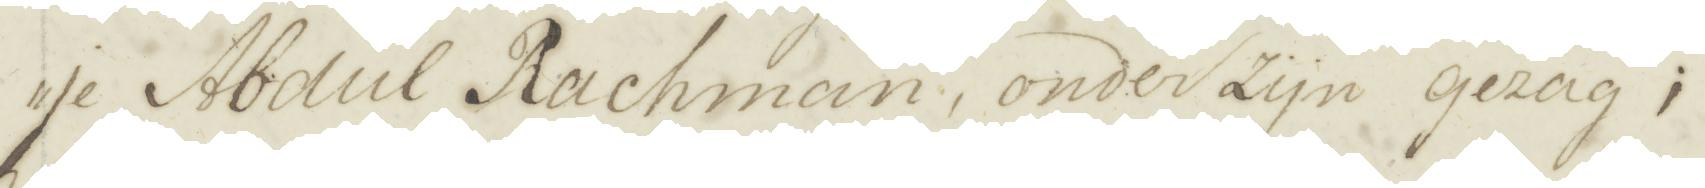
„je Abdul Rachman, onder zijn gezag ;
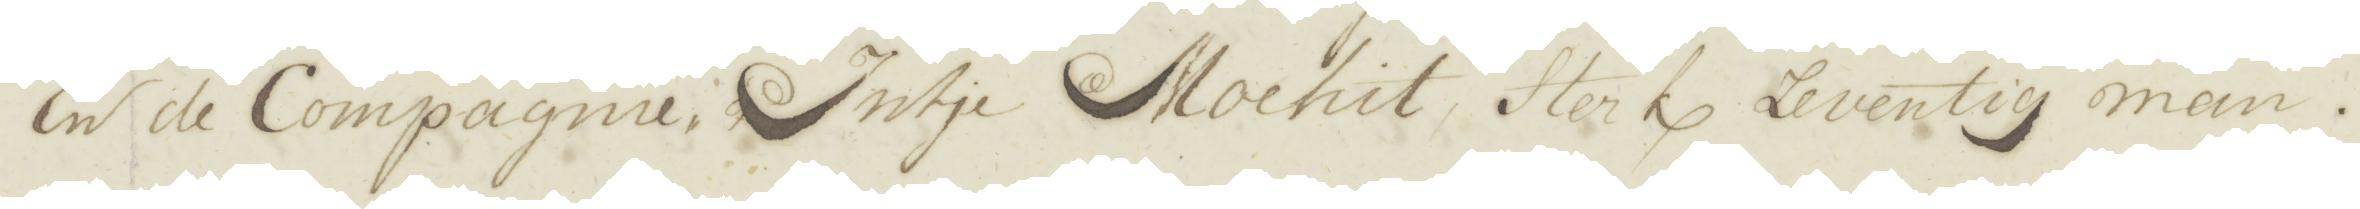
En de Compagnie „ Intje Moehit, Sterk Zeventig man.
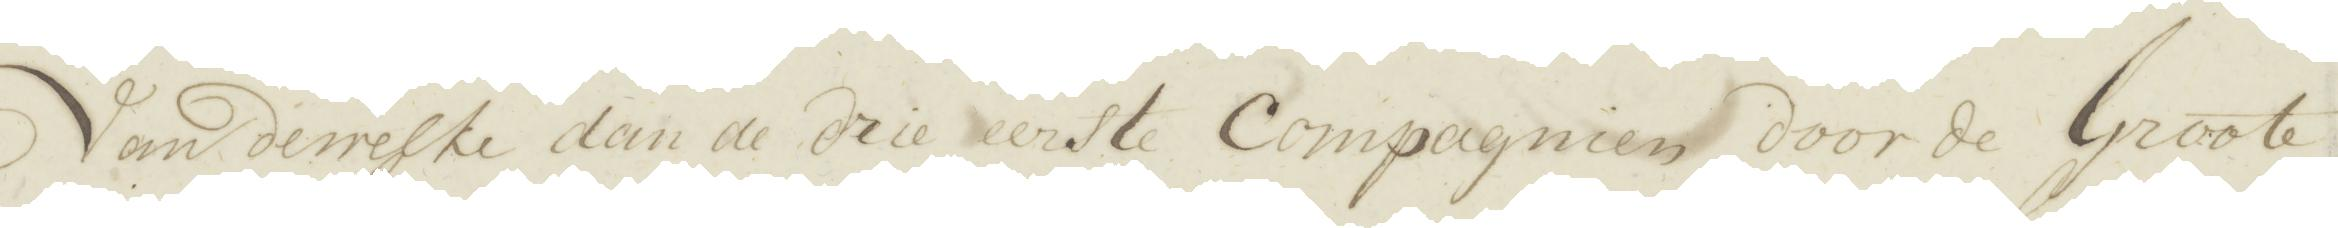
Van dewelke dan de drie eerste Compagnien door de Groote
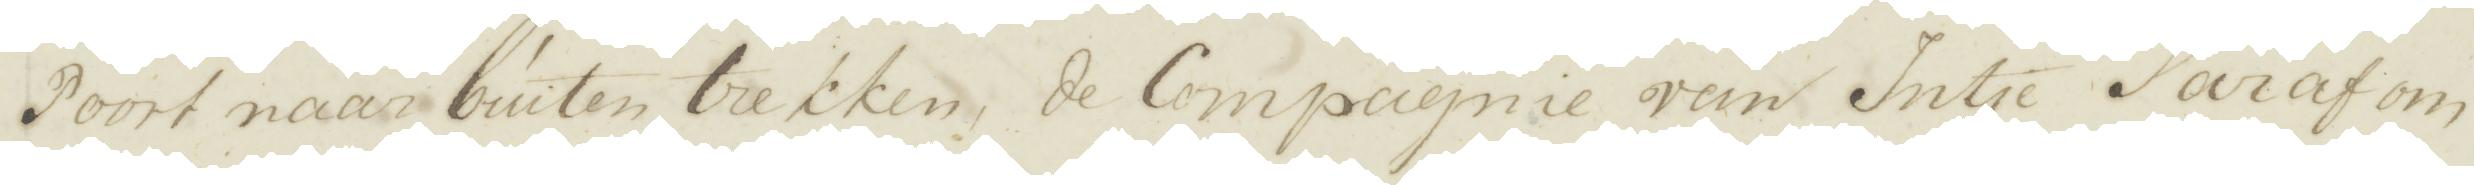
Poort naar buiten trekken, de Compagnie van Intje Saraf om
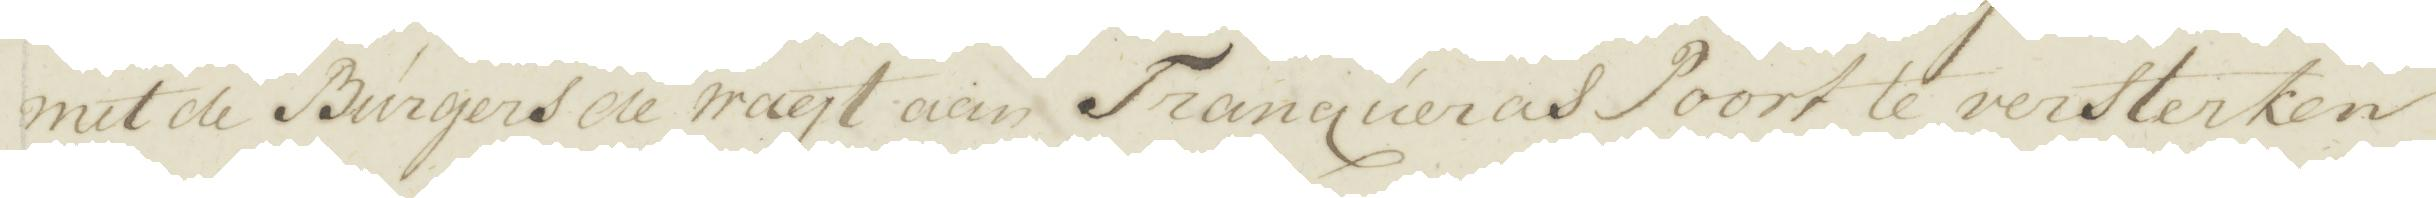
met de Burgers de wagt aan Tranqueras Poort te versterken
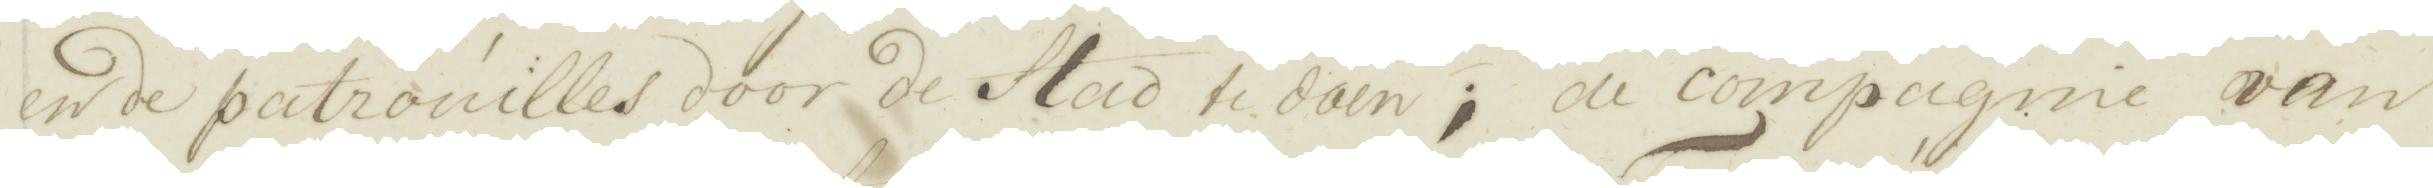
en de patrouilles door de Stad te doen; de compagnie van
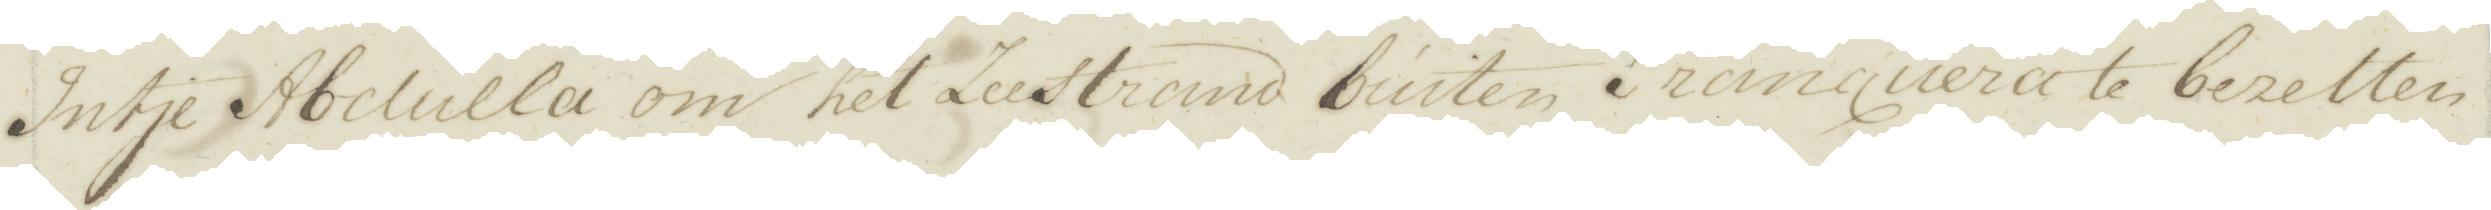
Intje Abdulla om het Zeestrand buiten Tranquera te bezetten
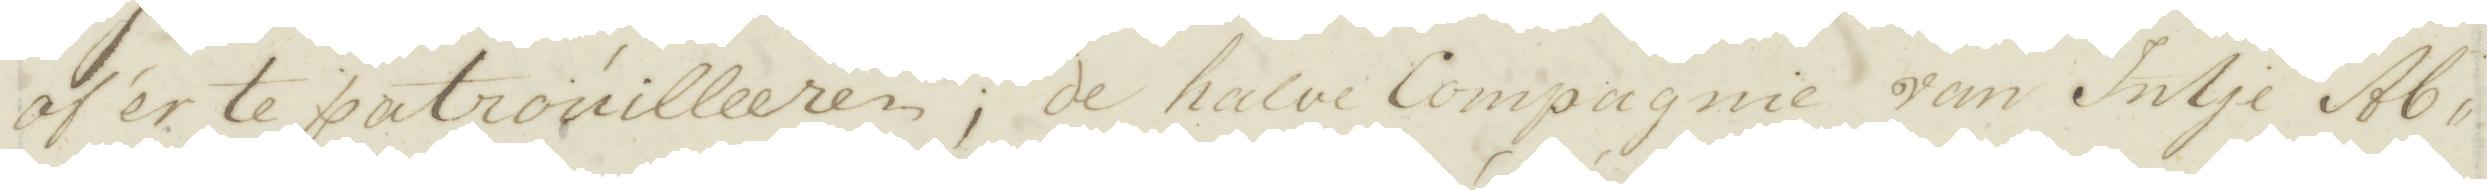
of er te patrouilleeren; de halve Compagnie van Intje Ab„
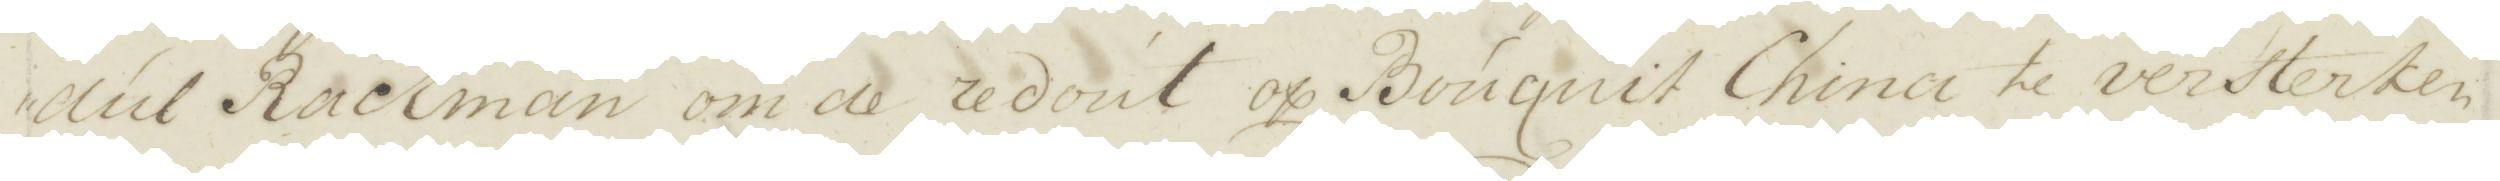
dul Rachman om de redout op Bouquit China te versterken
